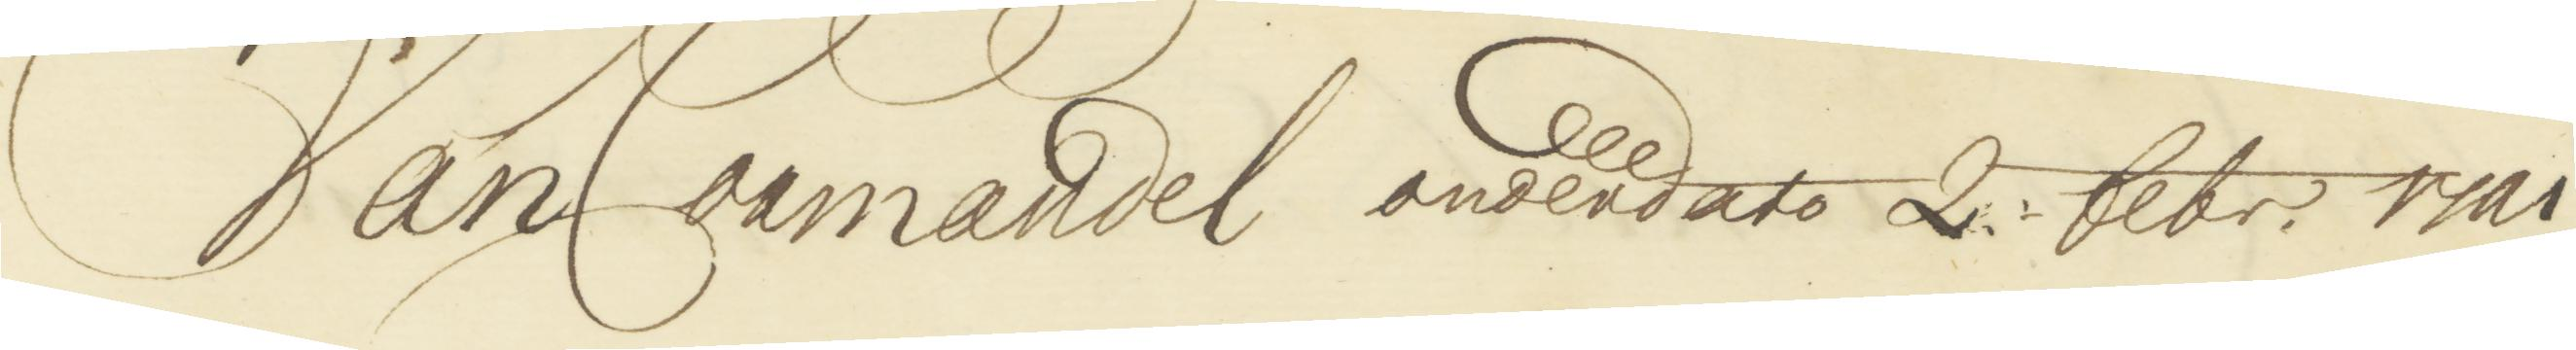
Van Cormandel onderdato 2: febr. 1741
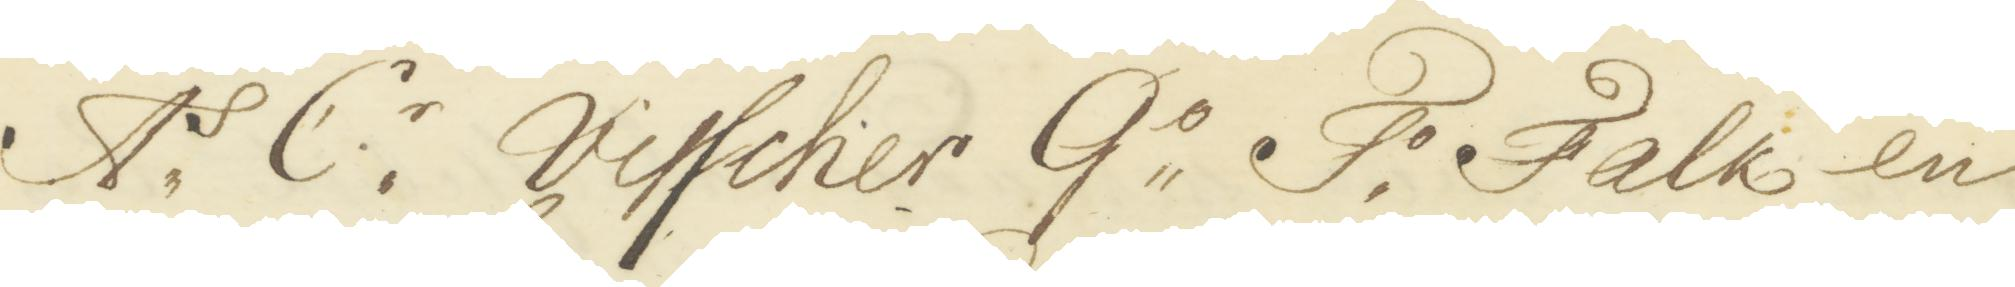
A„s C„r Visscher Q„o T:o Falk en
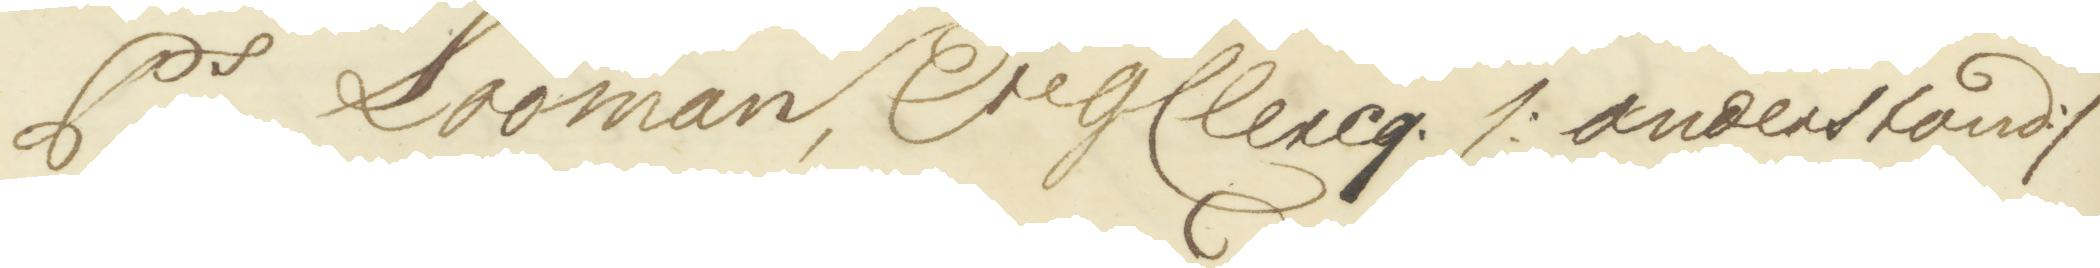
P:s Looman, Ereg Clercq. /:onderstond:/
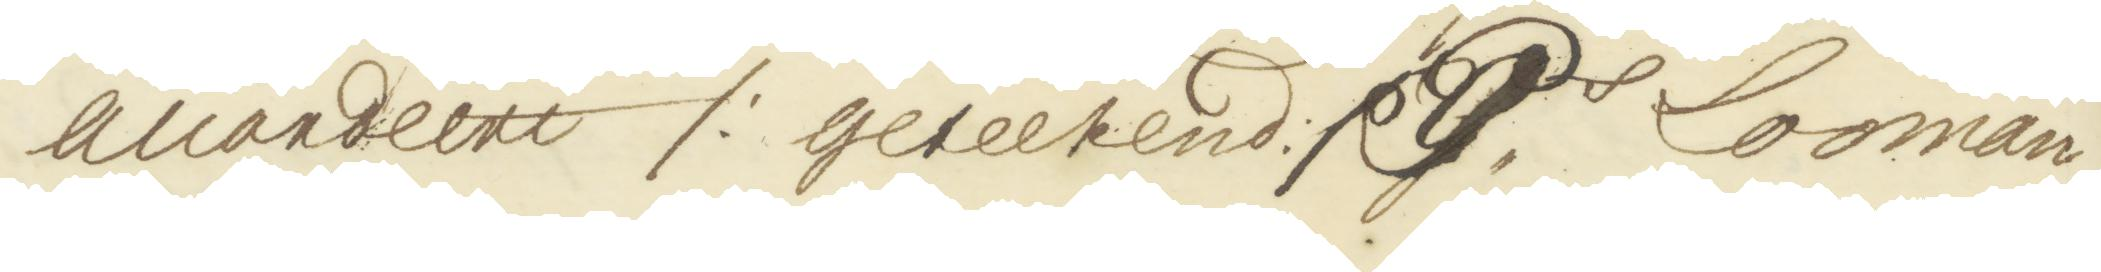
accordeert /:geteekend:/ : P:s Looman
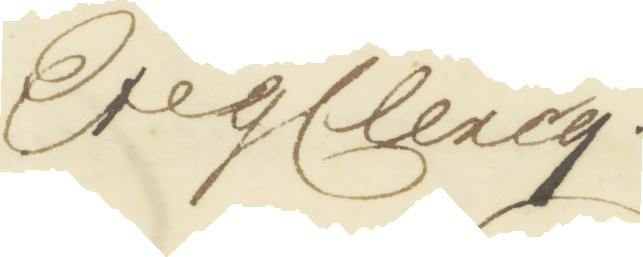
Ereg Clercq.
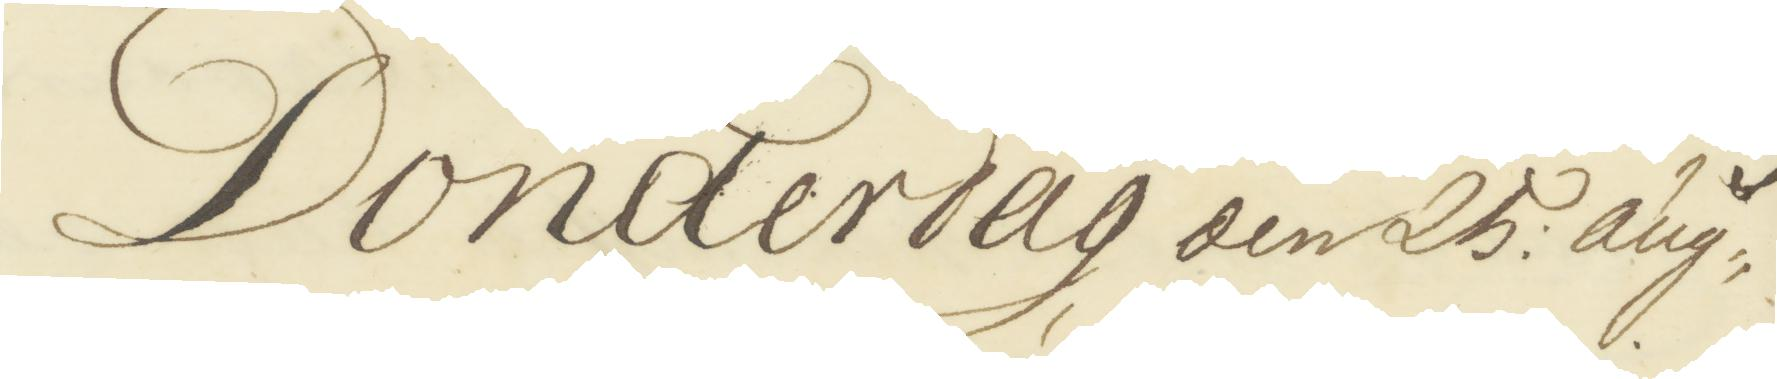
Donderdag den 25: aug„s
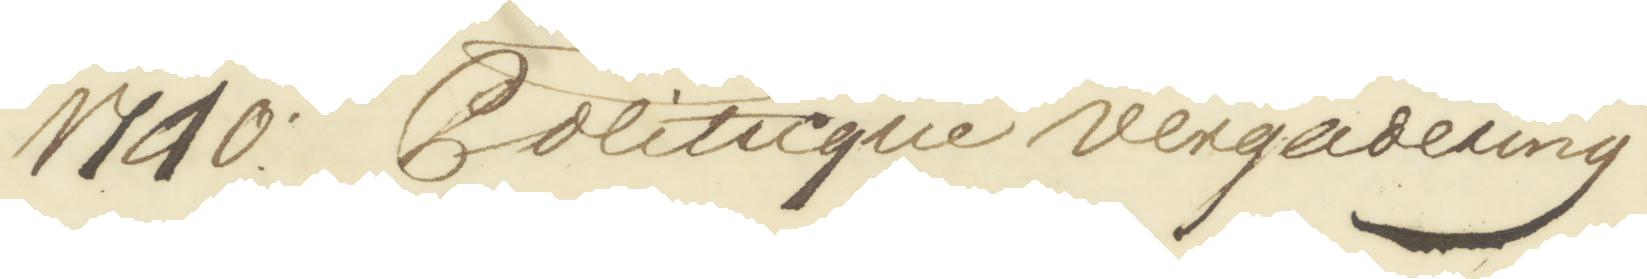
1740: Politicque vergadering
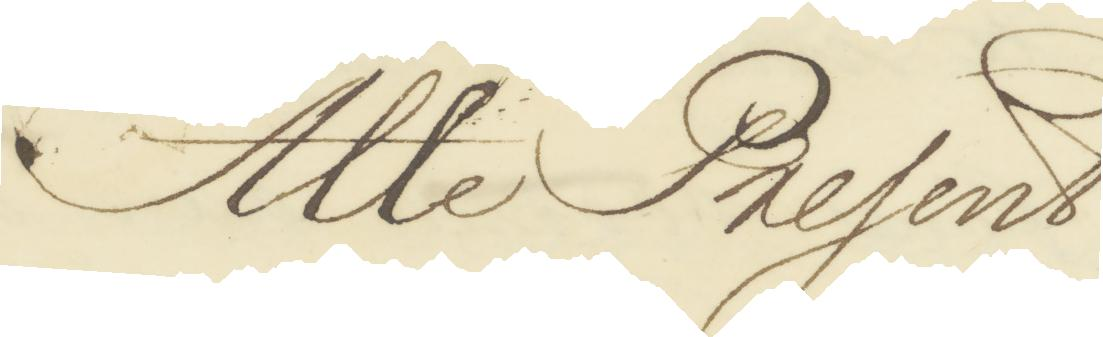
Alle Present
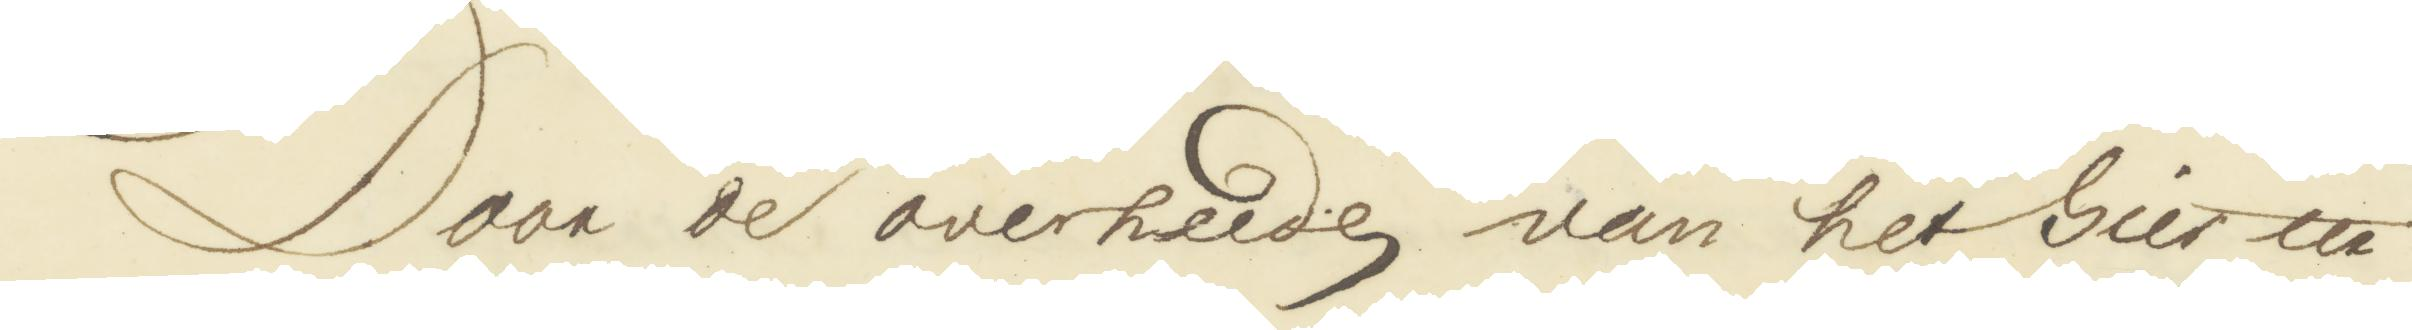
Door de overheeden van het hier ter
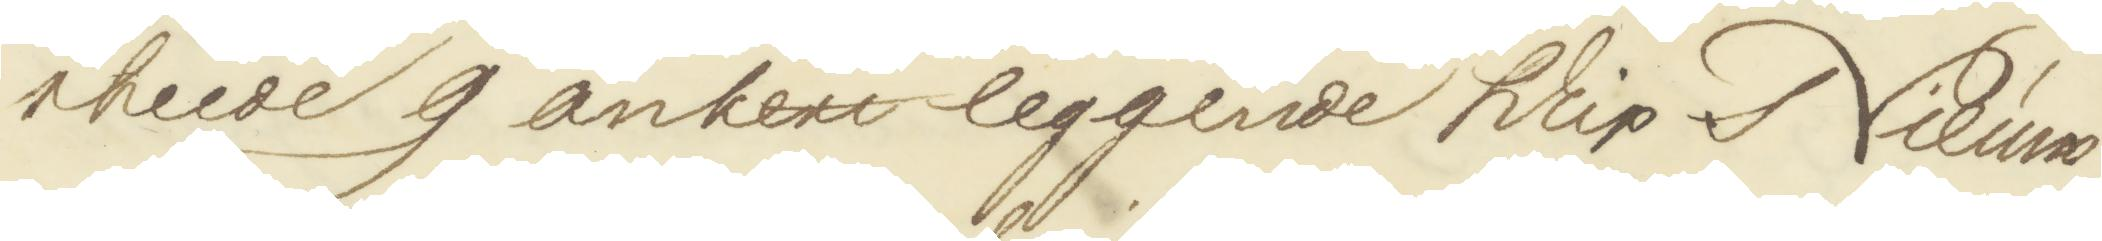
rheede g’ankert leggende schip Nieuw
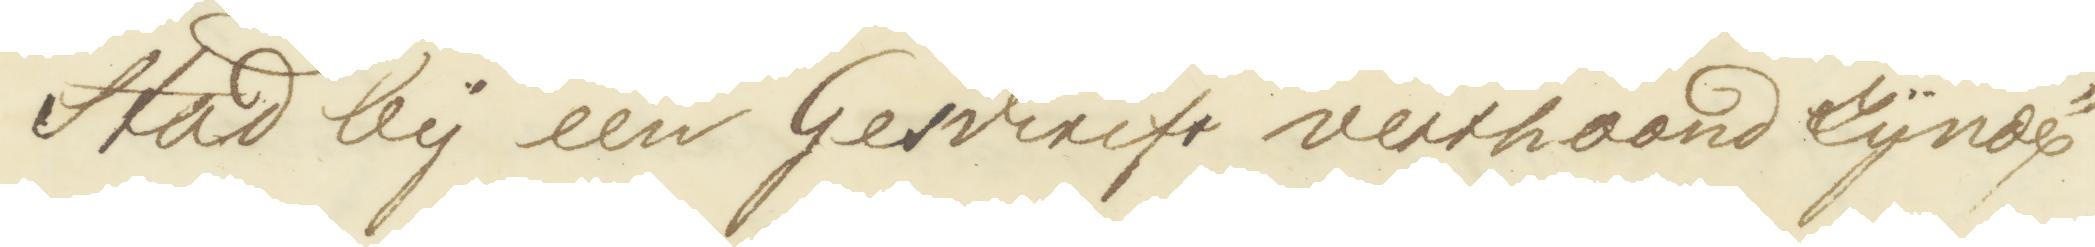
stad bij een Geschrift verthoond zijnde
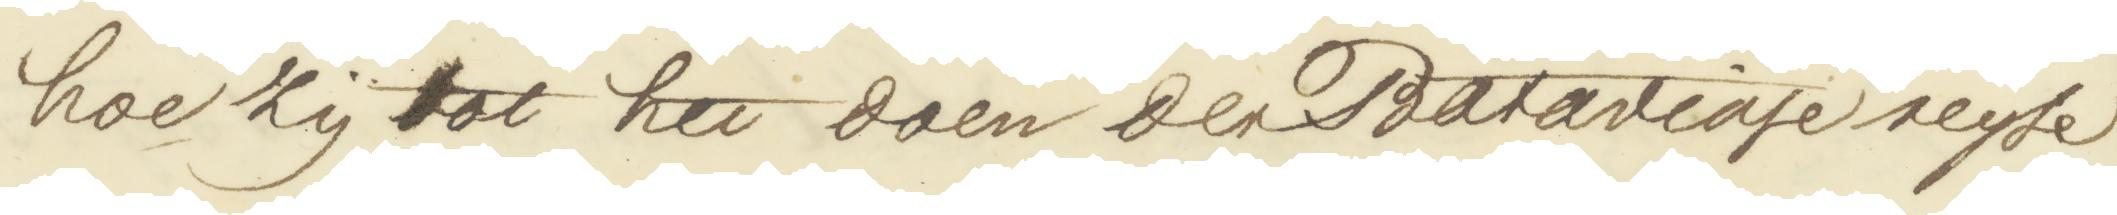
hoe zij tot het doen der Bataviase reijse
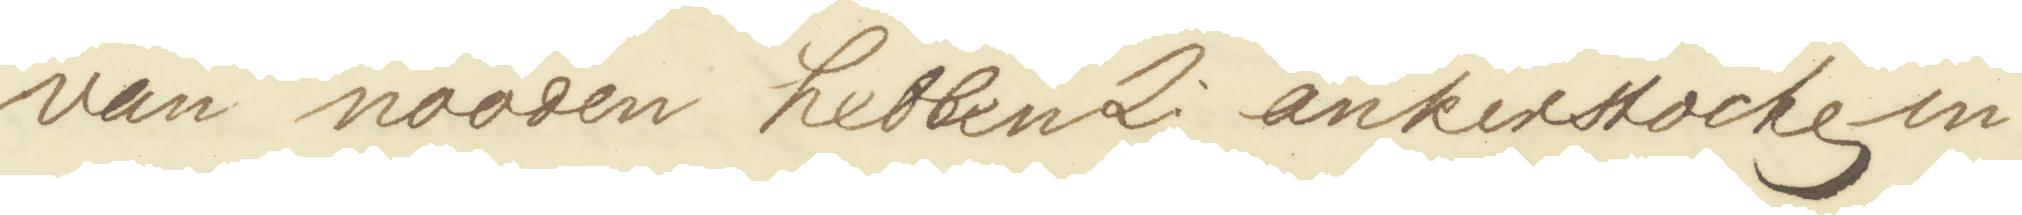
van nooden hebben 2: ankerstocken in
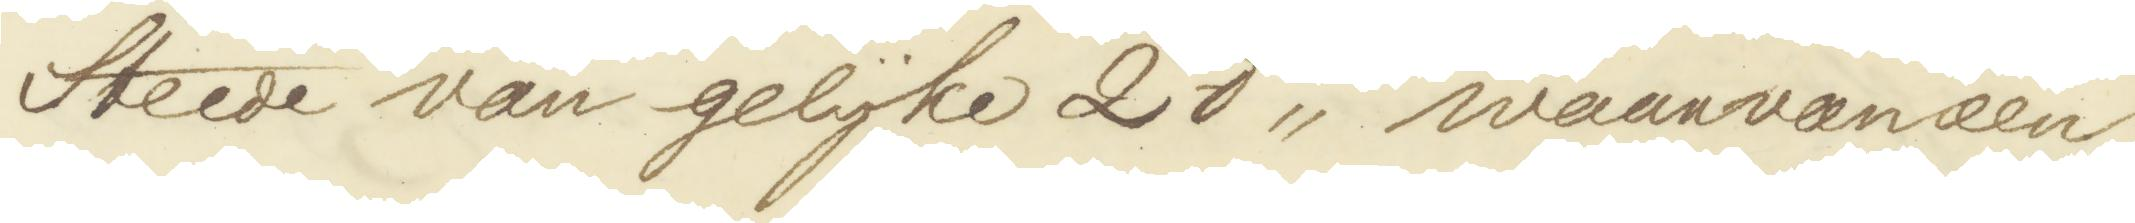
steede van gelijke 2. d„es waarvan een
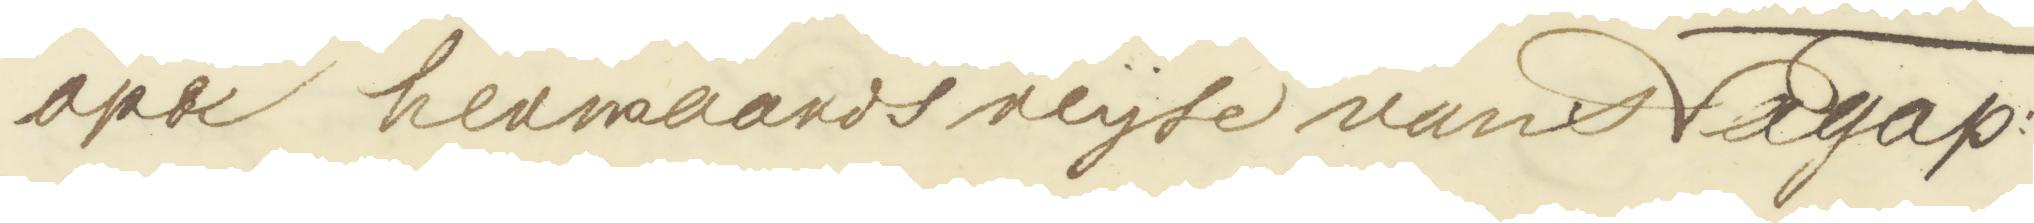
opde herwaards reijse van Nagap:
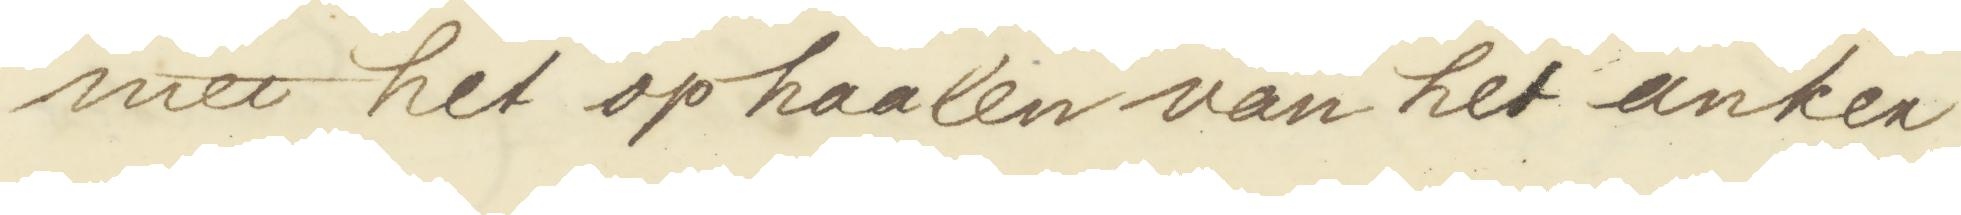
met het ophaalen van het anker
